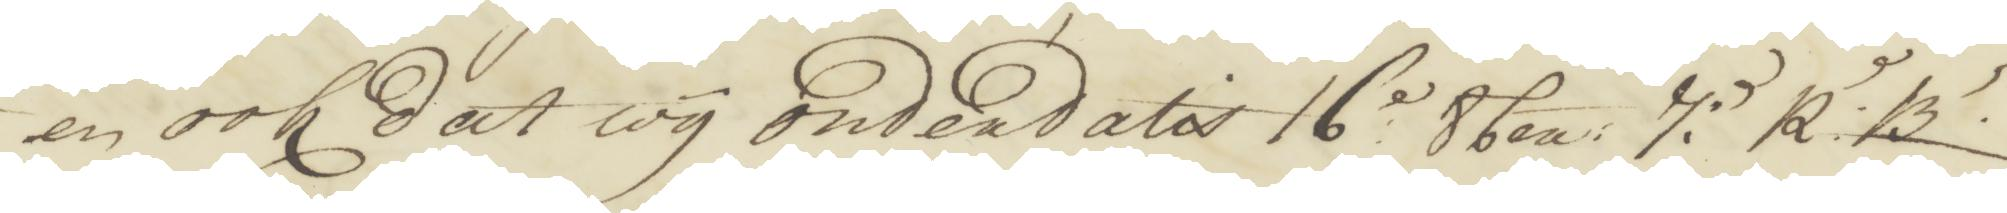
en ook dat wij onder datis 16:e 8ber: 7:e 12:e 13:e
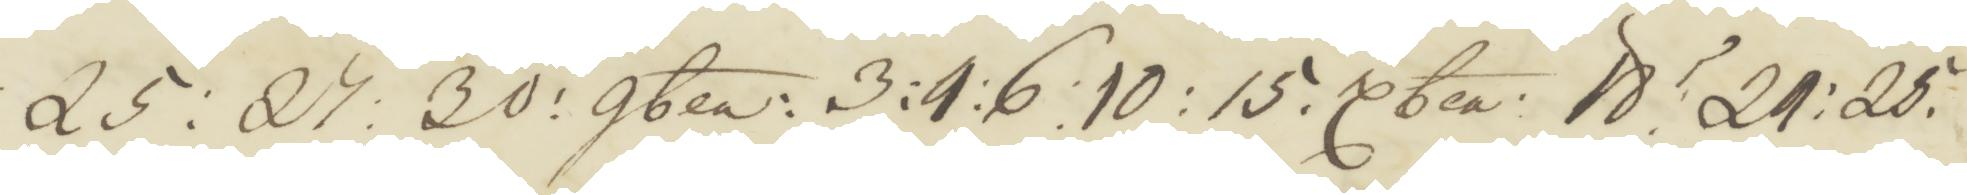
25: 27: 30: 9ber: 3: 4: 6: 10: 15. xber: 18:e 24: 25.
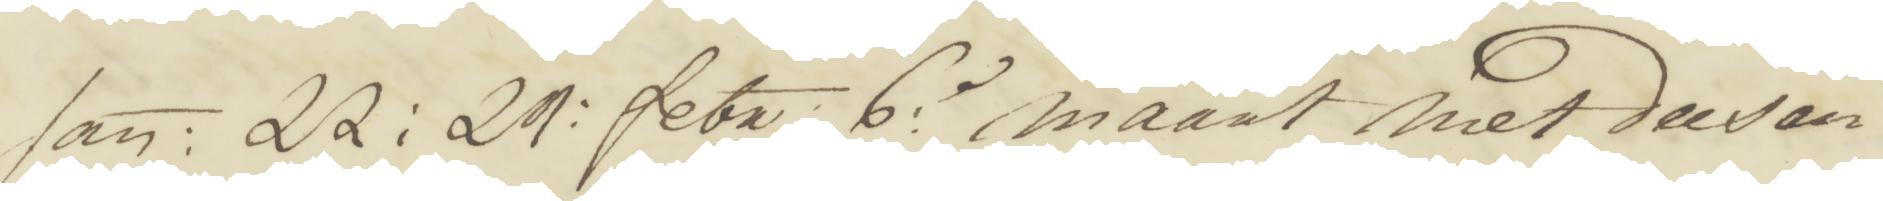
Jan: 22: 24: febr: 6:e maart met deesen
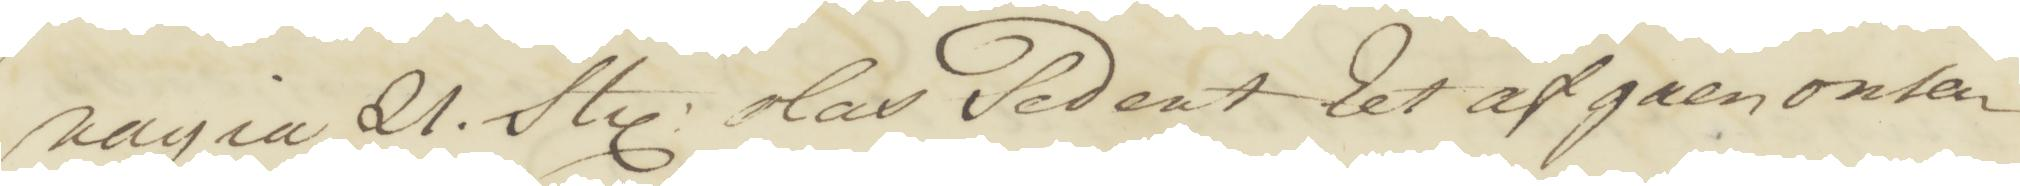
ragia 21. stx: olas sedert het af gaen onsen
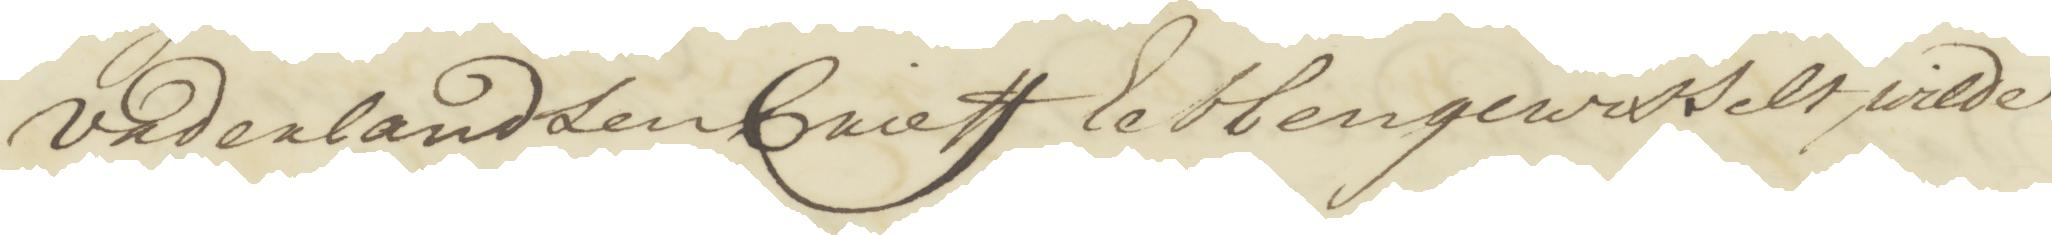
vaderlandsen brieff hebben gewisselt, wilde
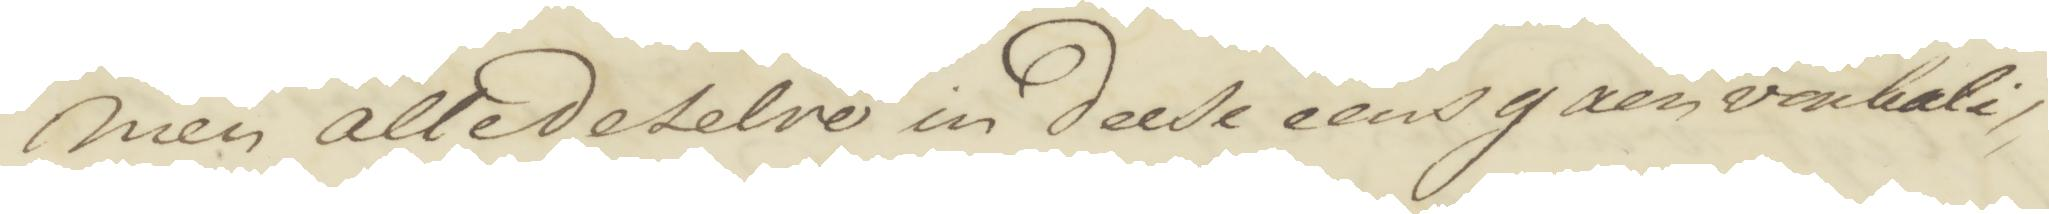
men alle deselve in deese eens gaen verbali„
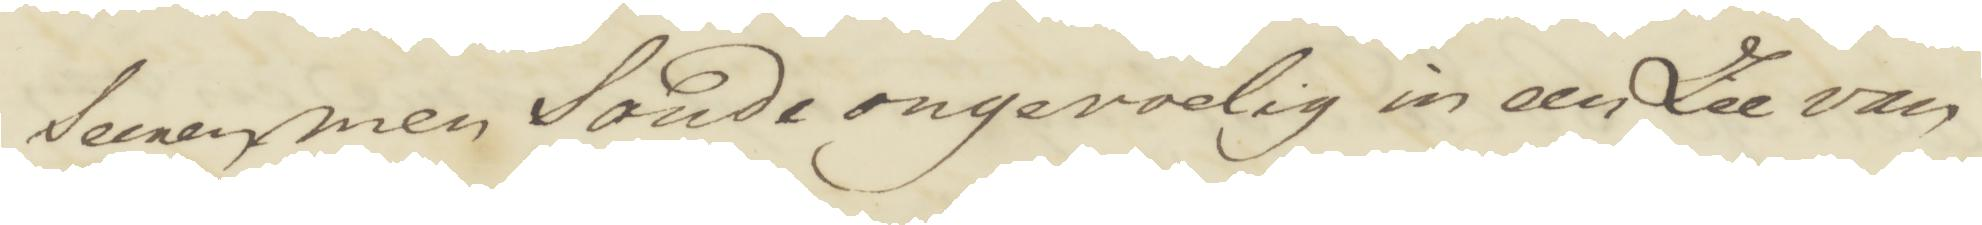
seeren men soude ongevoelig in een zee van
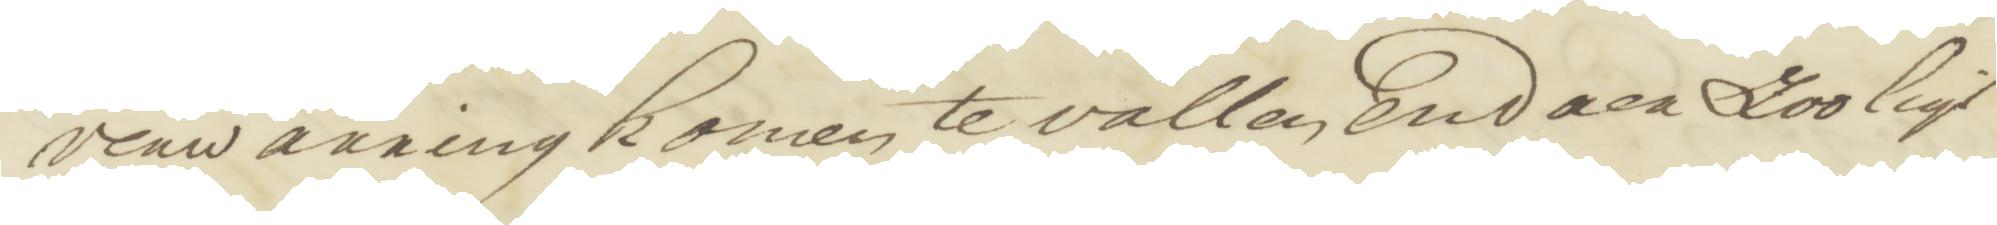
verwarring komen te vallen en daer zoo ligt
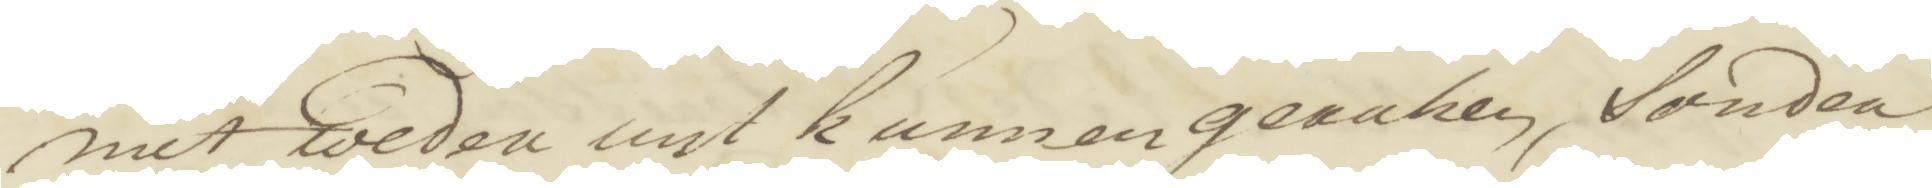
niet weder uyt kunnen geraken, sonder
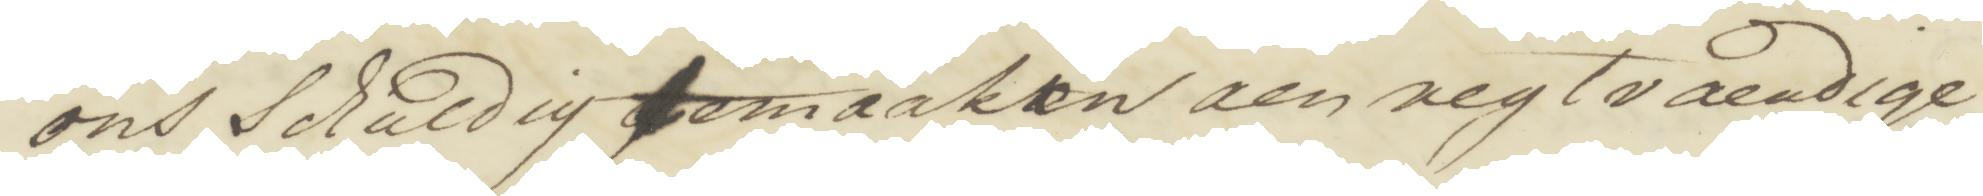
ons schuldig temaaken aen regtvaerdige
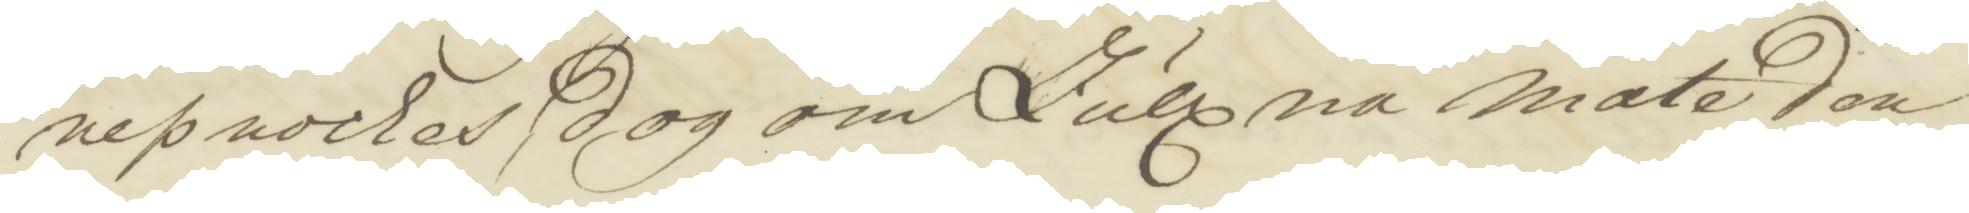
reproches, dog om zulx na mate der
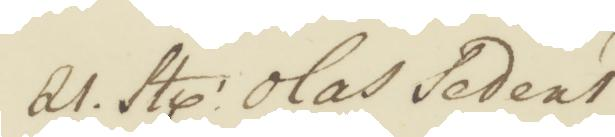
21. stx: olas sedert
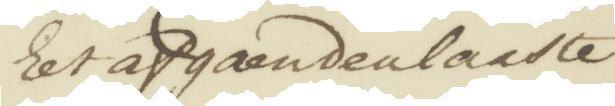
het afgaen den laaste
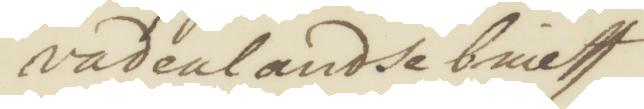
vaderlandse brieff
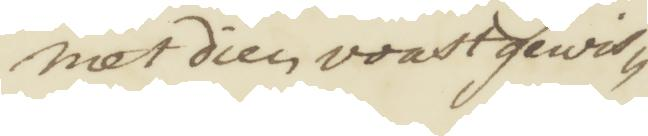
met dien vorst gewis„
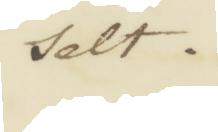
selt
